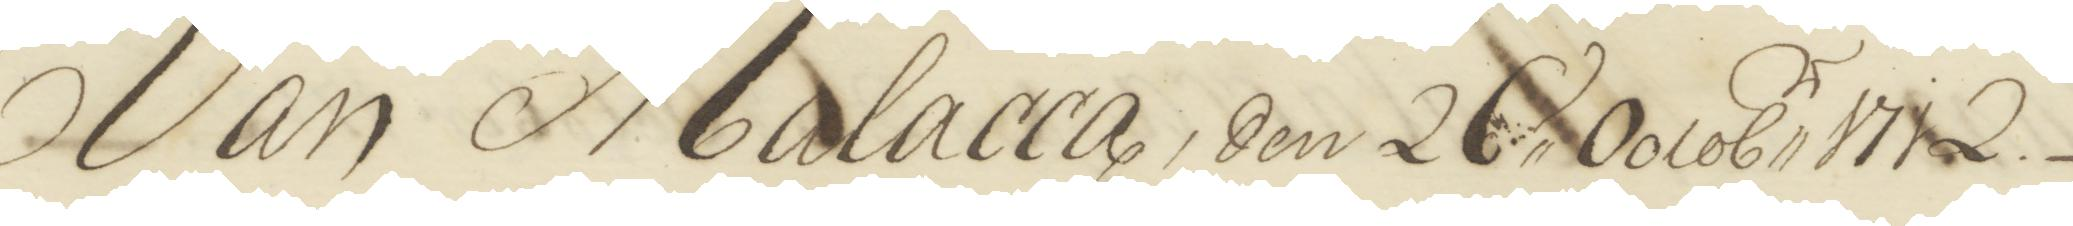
Van Malacca, den 26„' Octob„r 1712.
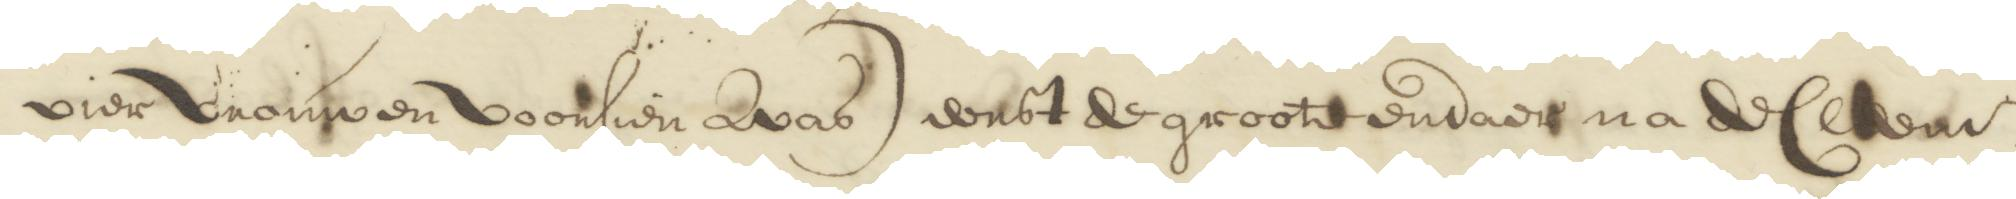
vier vrouwen voorsien was) eerst de groote en daer na de cleene
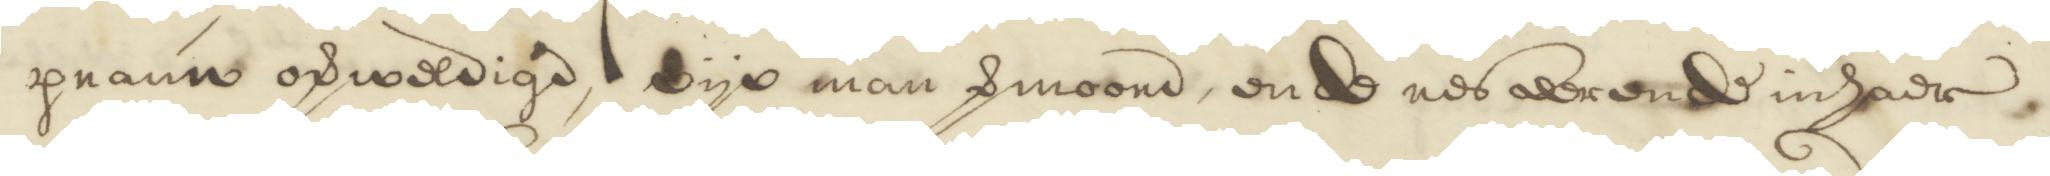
prauw overweldigd, vijv man vermoord, ende resteerende in haer
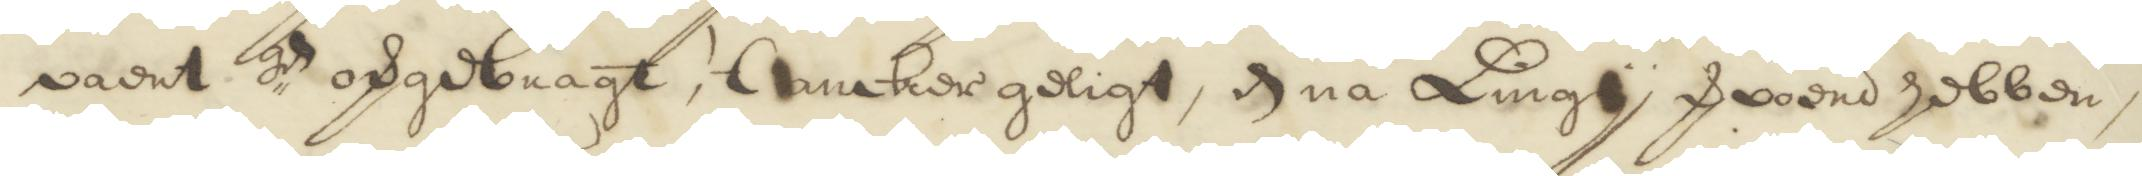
vaert „gen overgebragt, 't tancker geligt, en na Lingij vervoerd hebben,
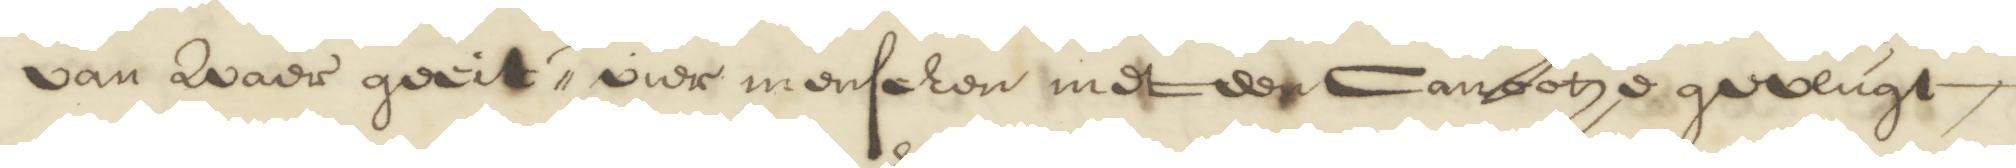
van waer gecit„' vier menschen met een Canootje gevlugt,
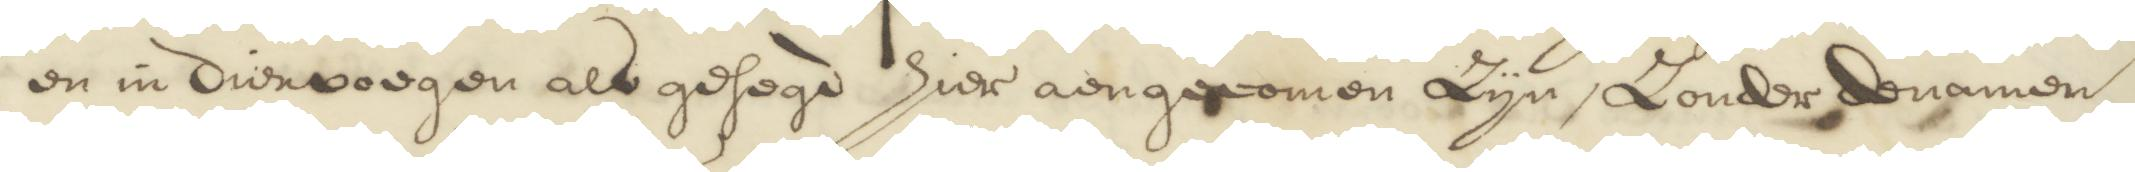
en in diervoegen als gesegd hier aengecomen Zijn, zonder de namen
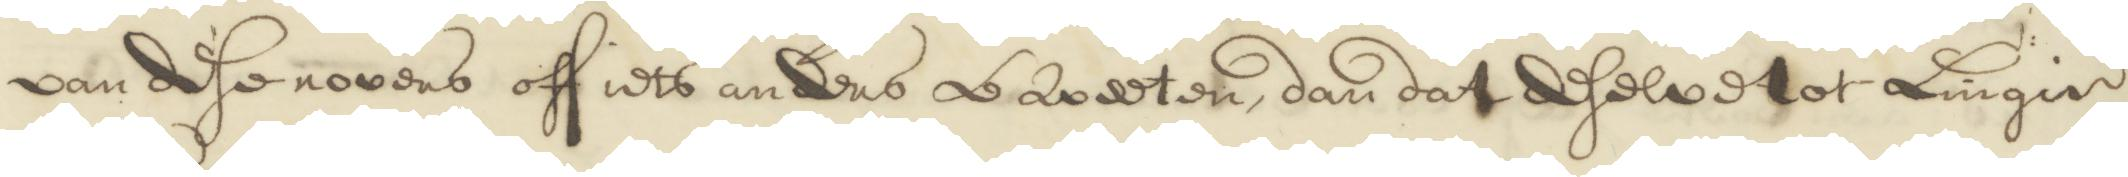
van dese rovers off iets anders te weeten, dan dat deselve tot Lingie
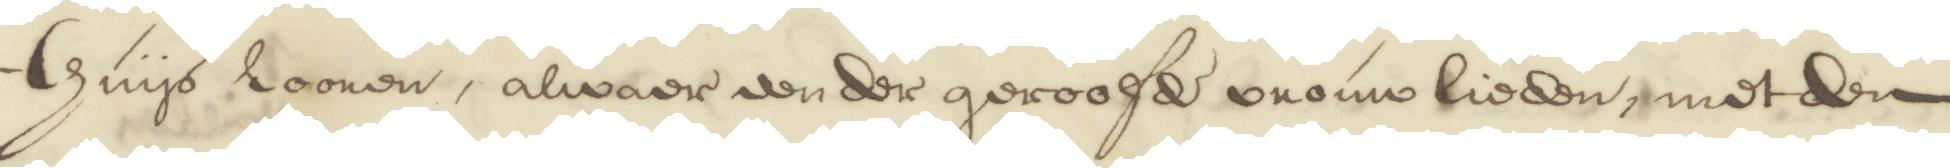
thuijs hooren, alwaer een der geroofde vrouw lieden, met den
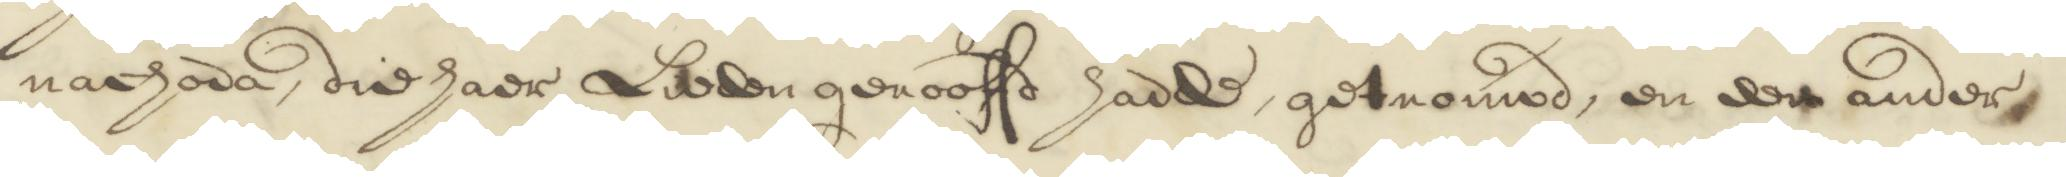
nachoda, die haer Lieden gerooffd hadde, getrouwd, en een ander
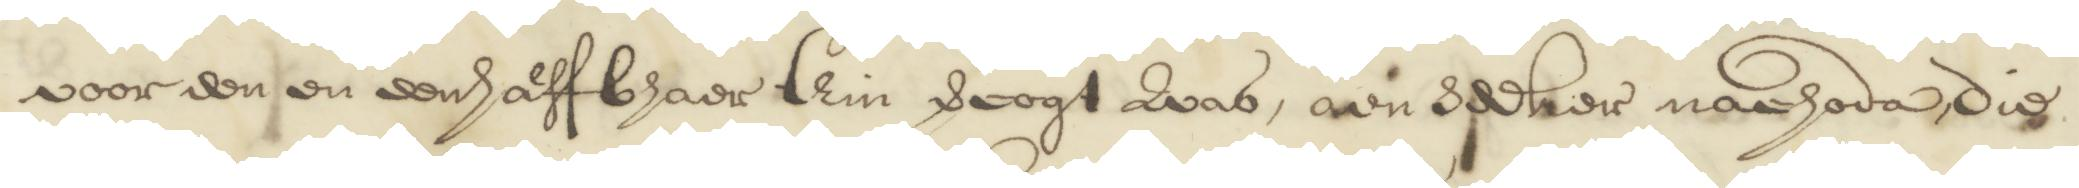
voor een en eenhalff bhaer thin vercogt was, aen seeker nachoda, die
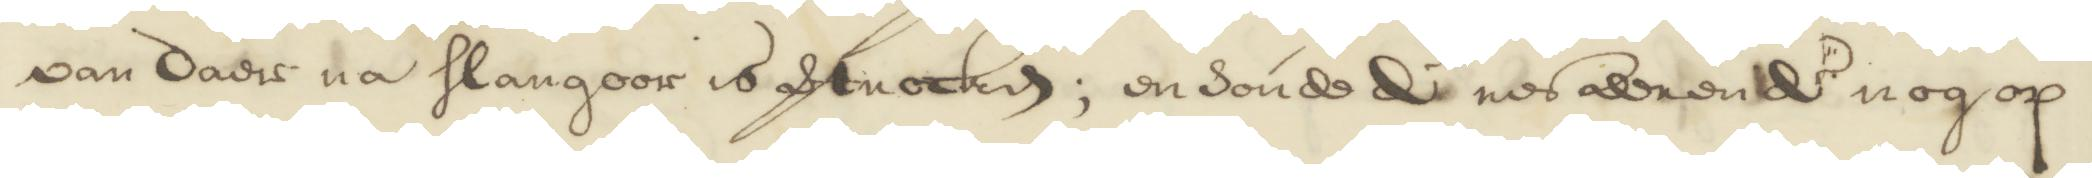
van daer na slangoor is vertrocken; en soude de resteeren de nog op
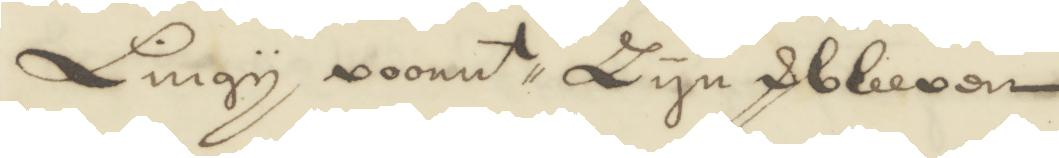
Lingij voorn„t Zijn verbleeven
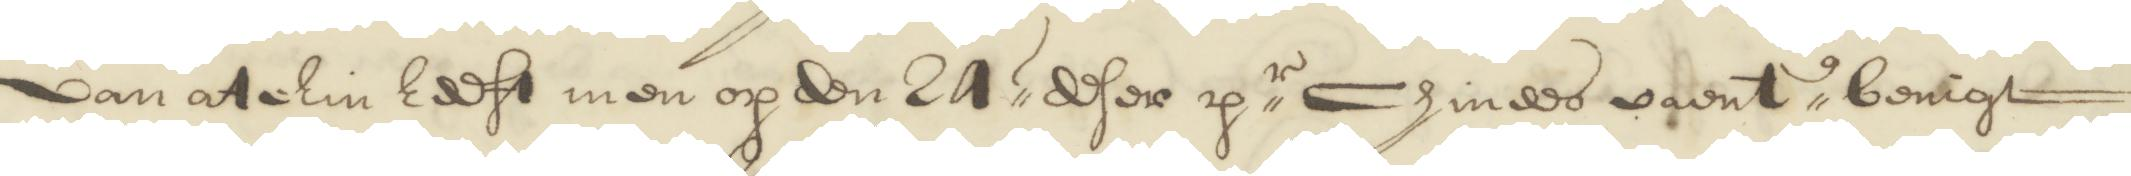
Van atchin heeft men op den 24„' deser p„r Chinees vaert„g berigt
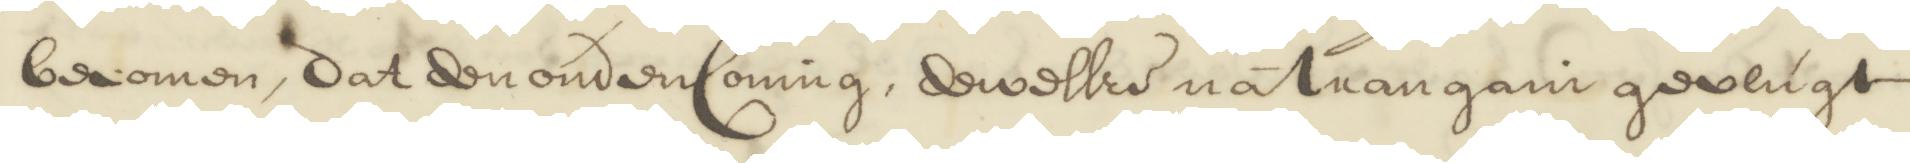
becomen, dat den ouden Coning, dewelke na trangani gevlugt
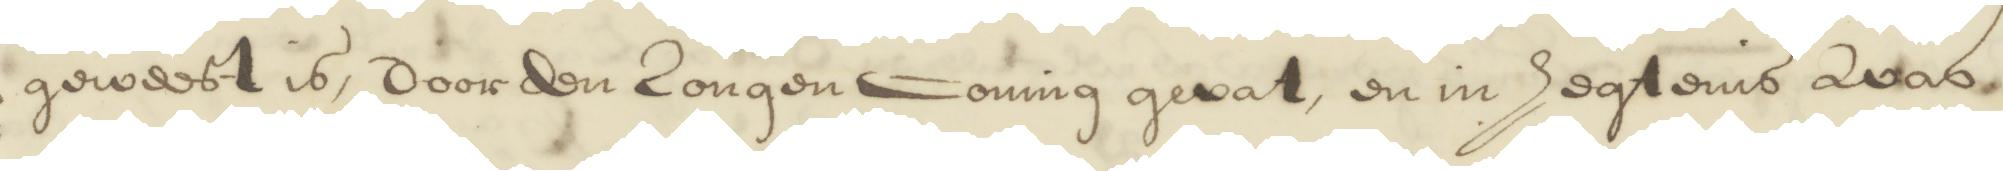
geweest is, door den Iongen Coning gevat, en in hegtenis was
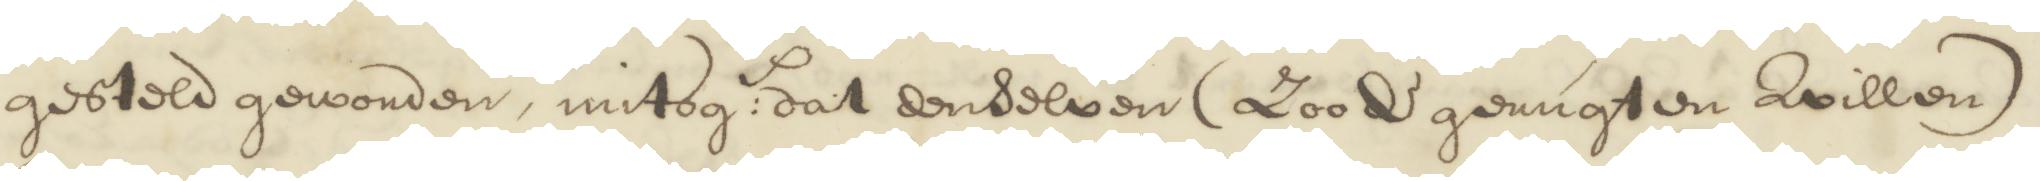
gesteld geworden, mitsg:s dat denselven (Zoo de gerugten willen)
